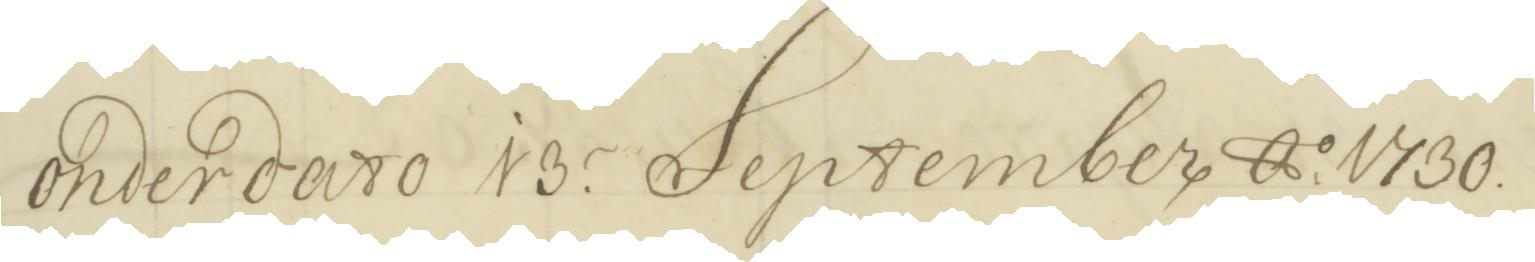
onder dato 13.' September A:o 1730.
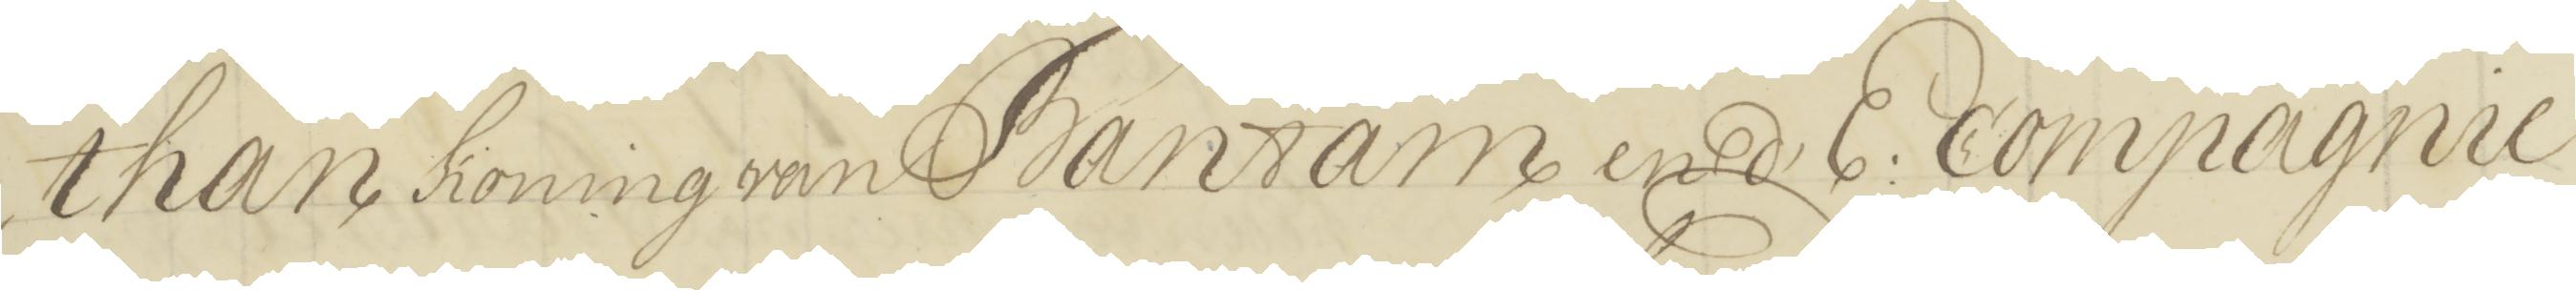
than koning van Bantam en d' E: Compagnie
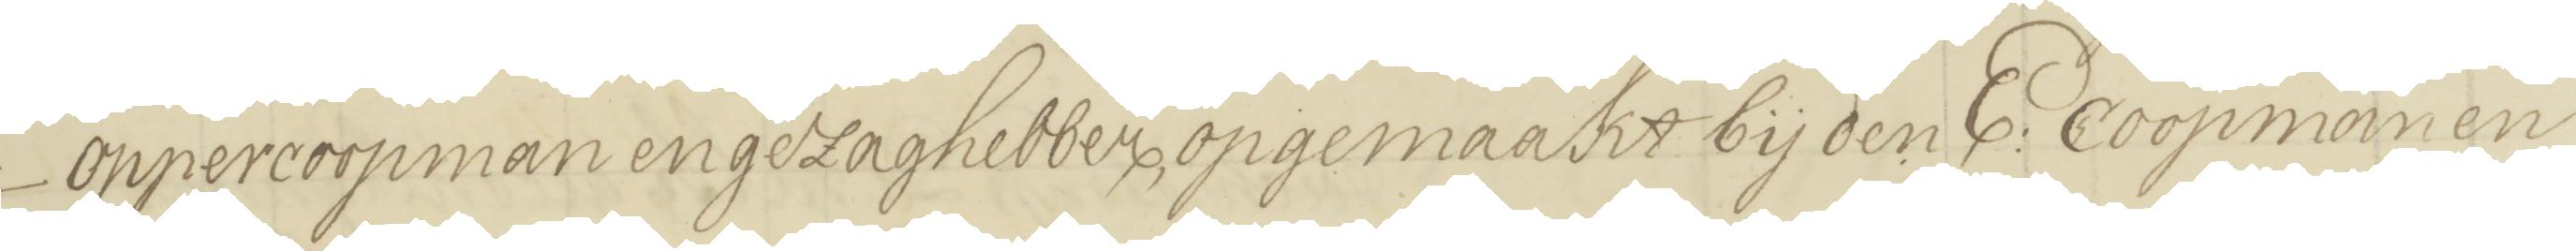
oppercoopman en gezaghebber, opgemaakt bij den E: Coopman en
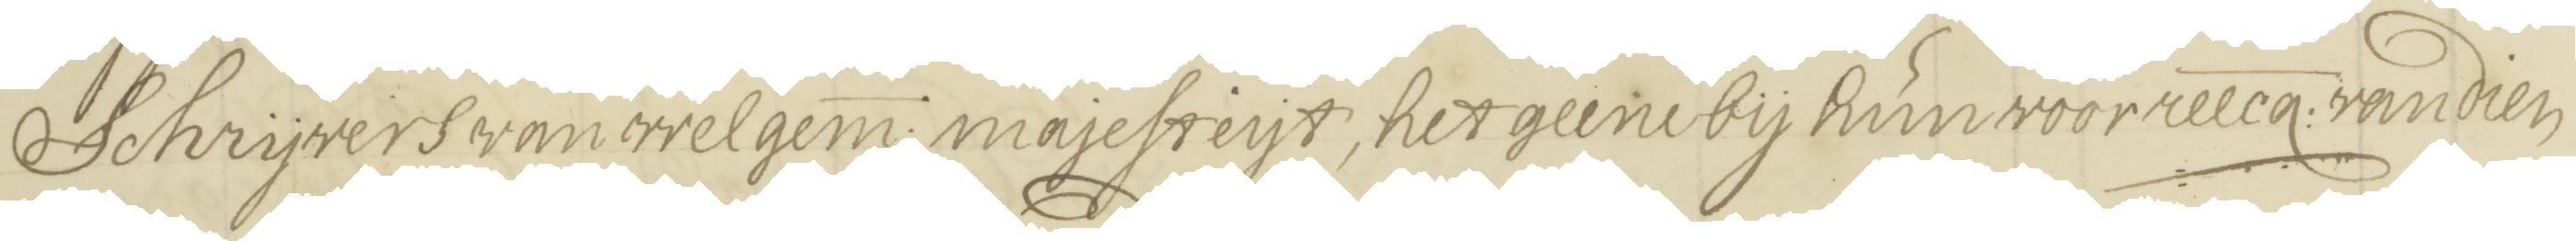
Schrijvers van wel gem: majesteijt, het geene bij hun voor reecq: van dien
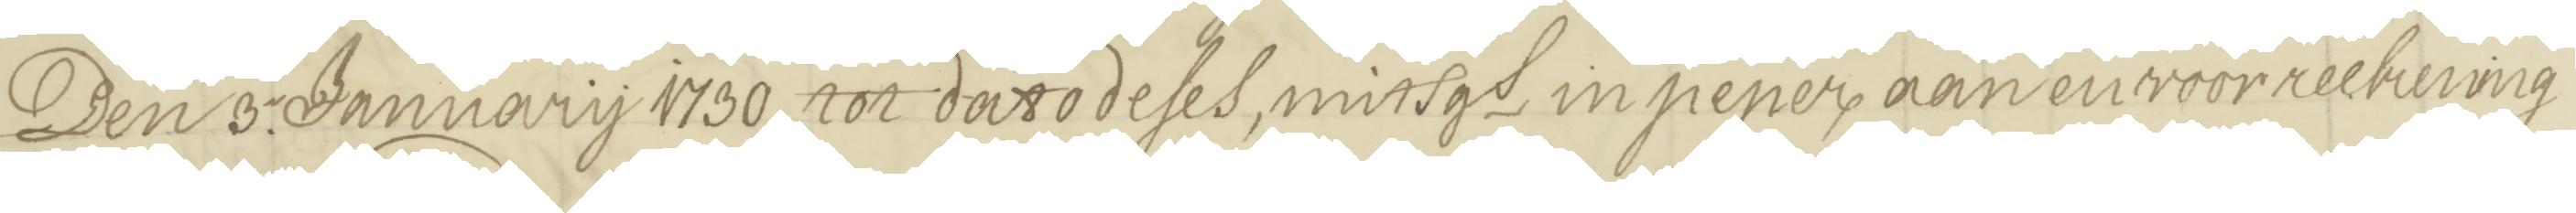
Den 3: Ianuarij 1730. tot dato deses, mitsg=s in peper aan en voor reekening
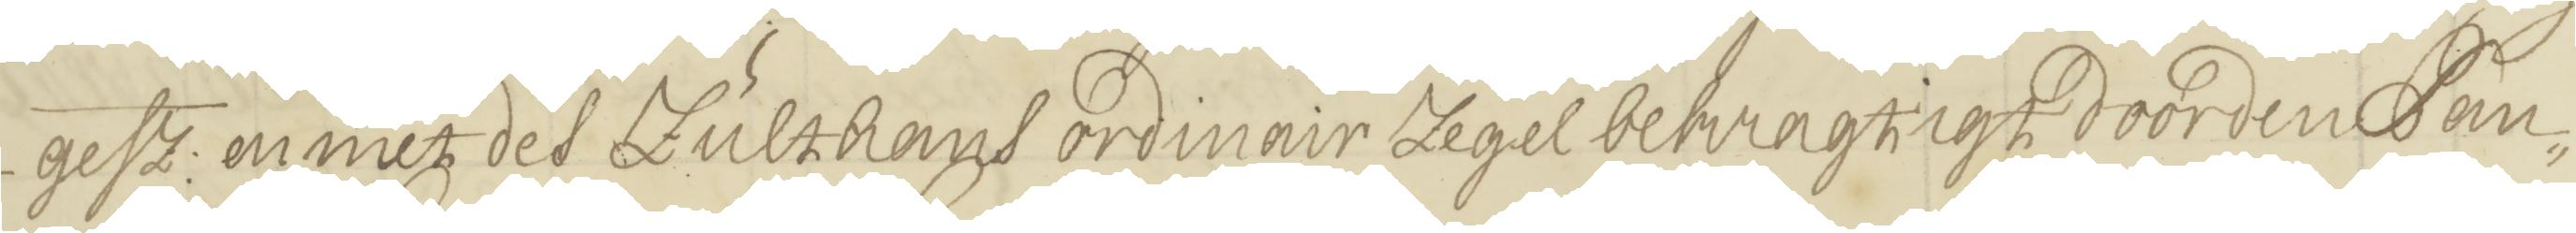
gesz: en met des Zulthans ordinair zegel bekragtigt door den Pan„
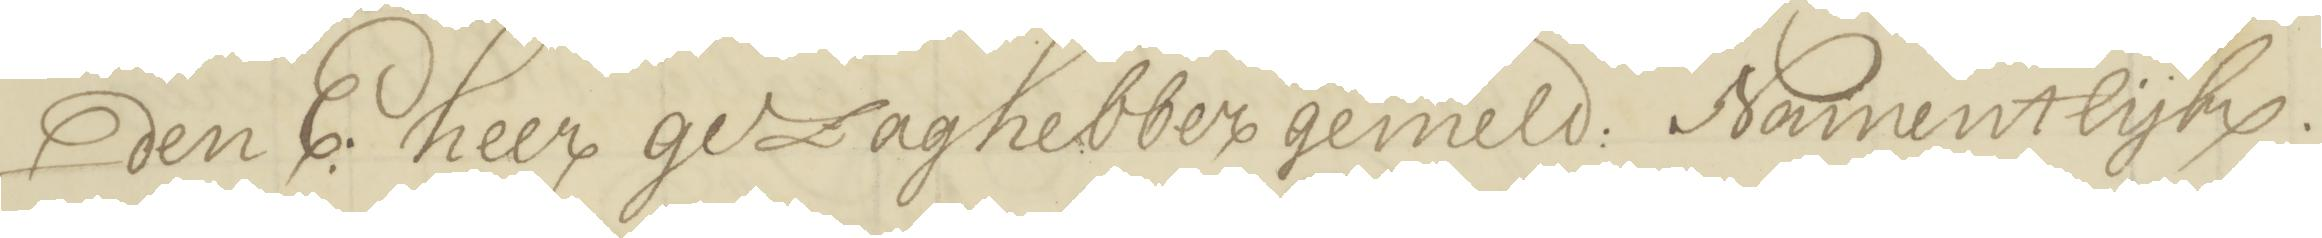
den E: heer gezaghebber gemeld. Namentlijk.
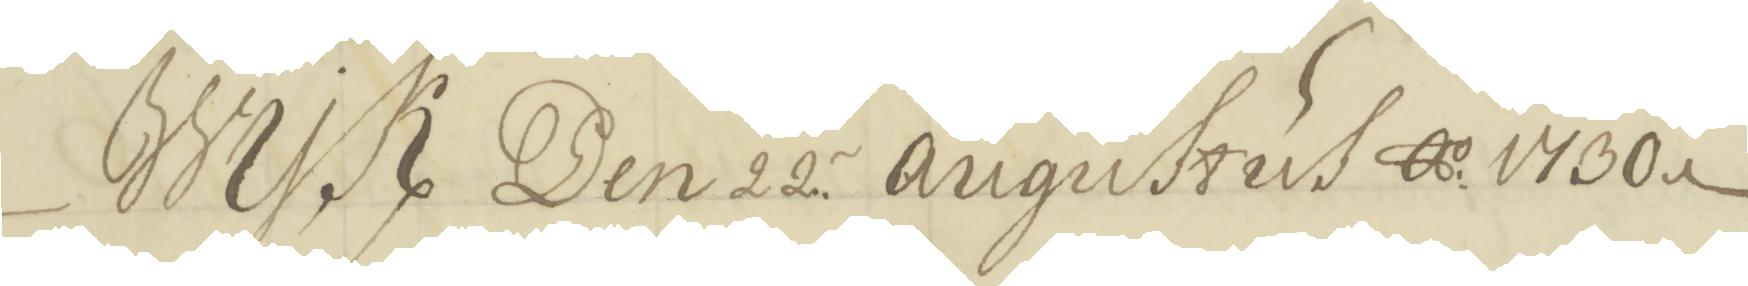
Wijk Den 22:' augustus A:o 1730
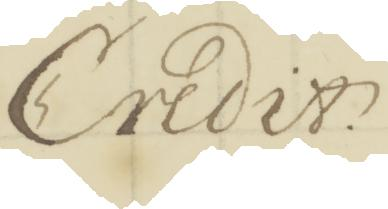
Credit.
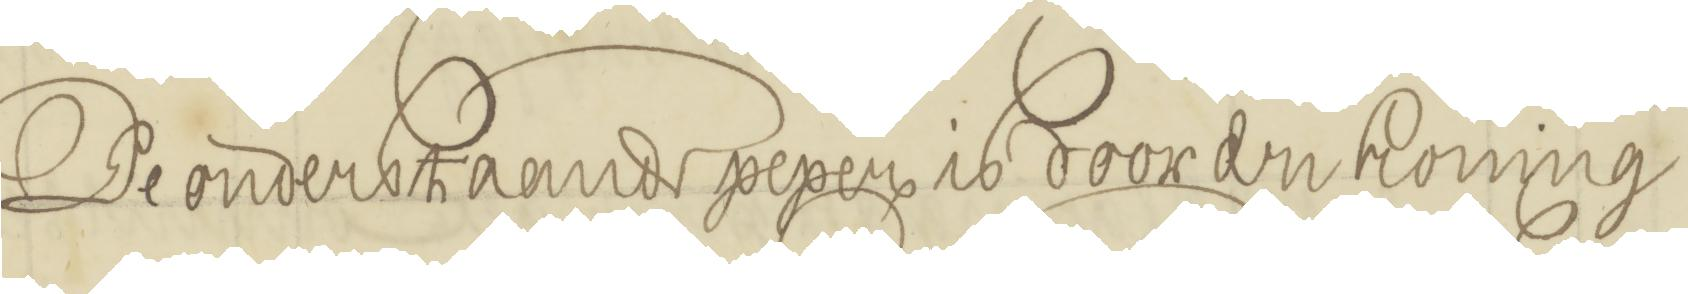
De onderstaande peper is door den koning
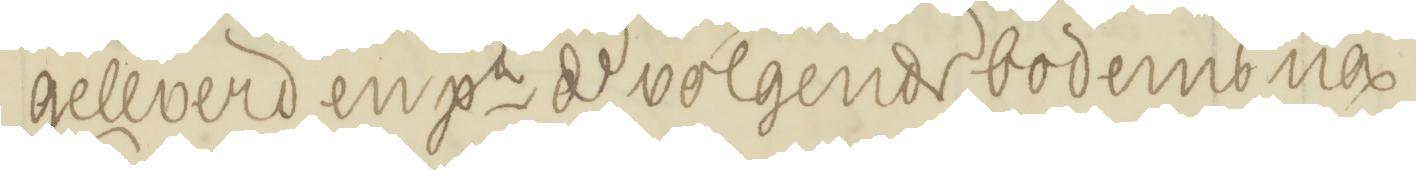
geleverd en p=r de volgende bodems na
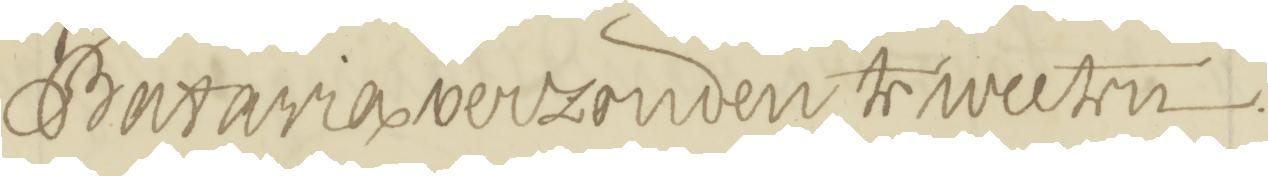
Batavia verzonden te weeten.
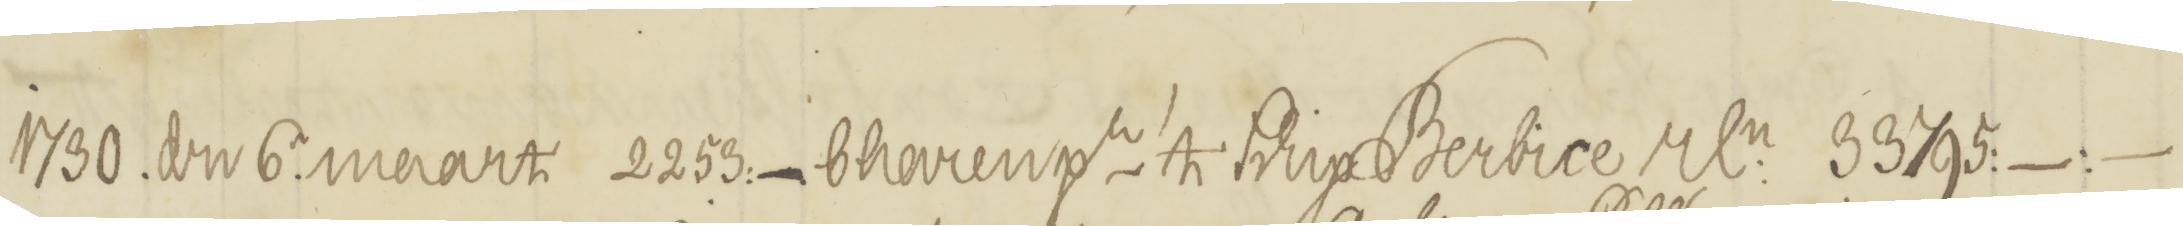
1730. den 6.' maart 2253:—. bharen p=r ’t schip Berbice rl:n 33795:—:—
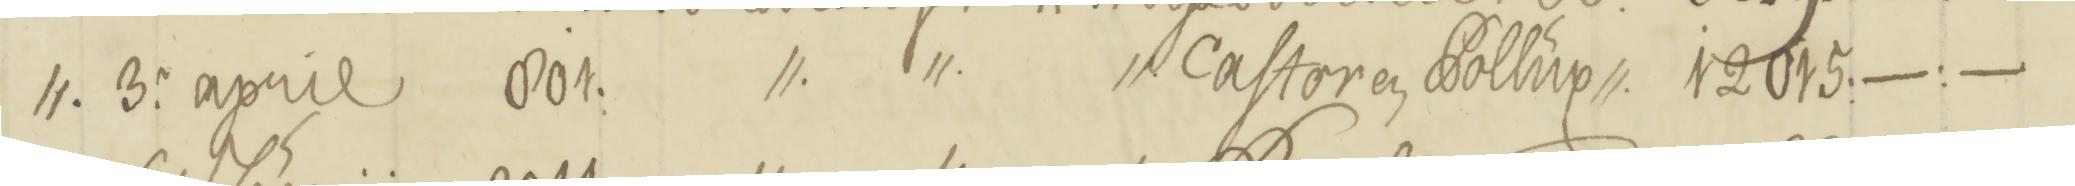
„. 3.' april 801: „. „. „ Castor en Pollux „. 12015:—:—
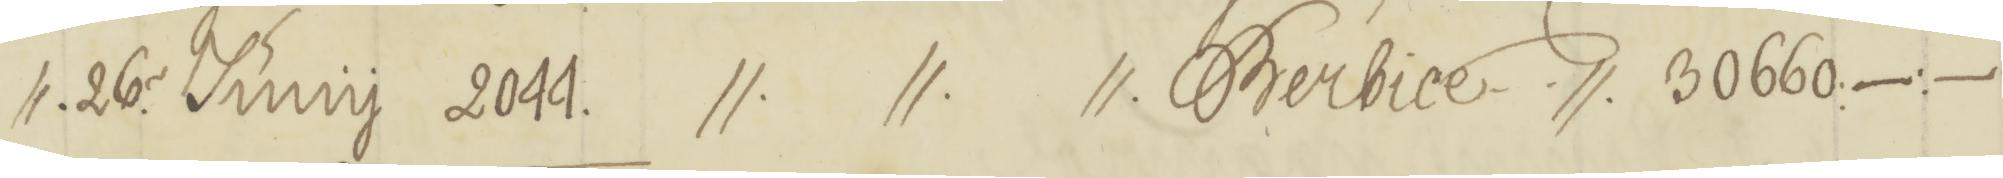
„. 26.' Iunij 2044. „. „. „. Berbice „. 30660:—:—
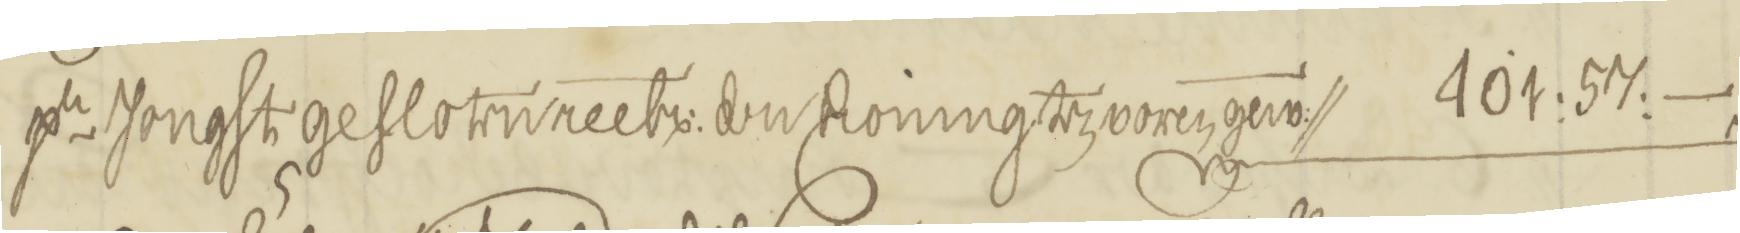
p=r Jongst gesloten reek: den koning ten voren gem:„ 401: 57:—
